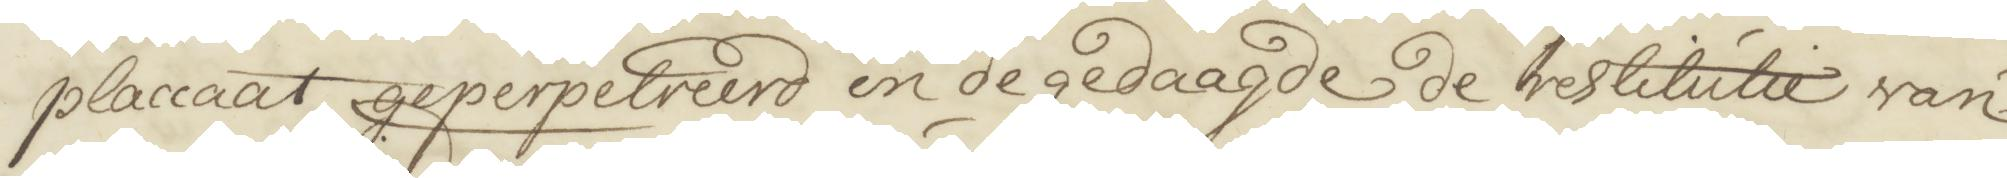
placcaat geperpetreerd en de gedaagde de restitutie van
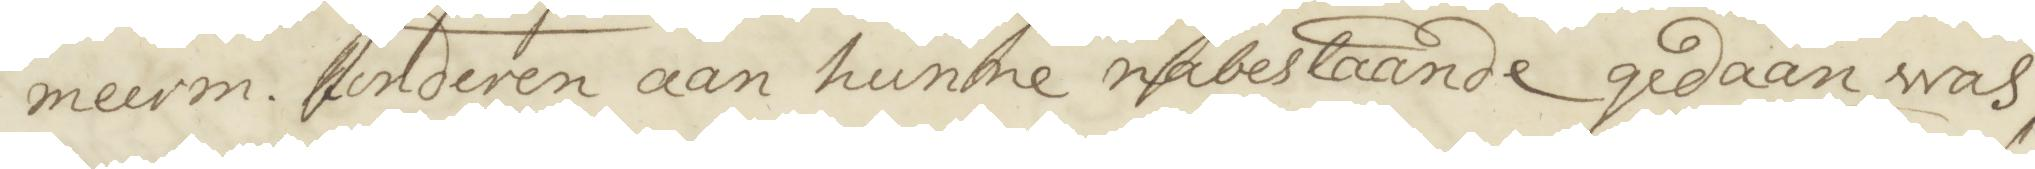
meerm. kinderen aan hunne nabestaande gedaan was
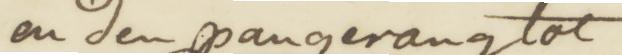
en den pangerang tot
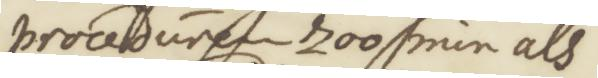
proceduren zoo min als
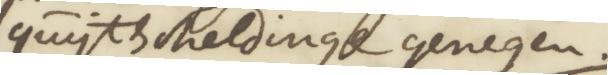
quijtscheldinge genegen.
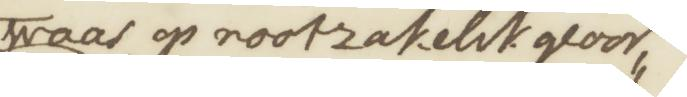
waar op nootzakelik geoor„
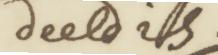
deeld is.
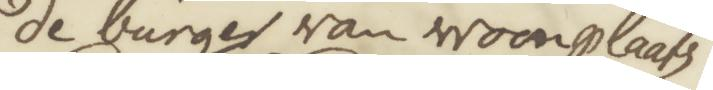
de burger van woonplaats
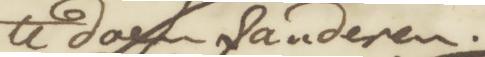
te doen veranderen.
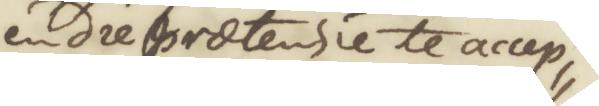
en die pretensie te accep„
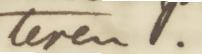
teren.
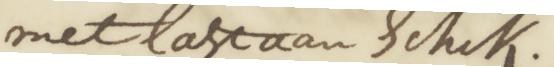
met last aan schik.
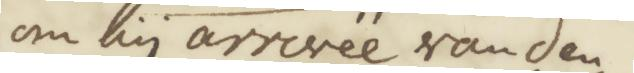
om hij arrivéé van den
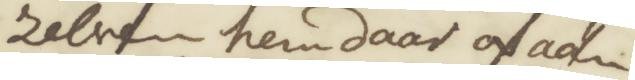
zelven hem daar over aan
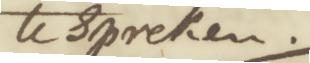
te spreken.
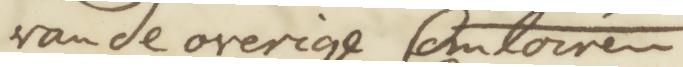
van de overige Comtoiren
